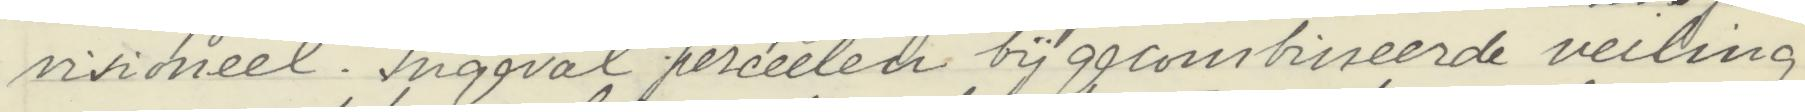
visioneel. Ingeval perceelen bij gecombineerde veiling
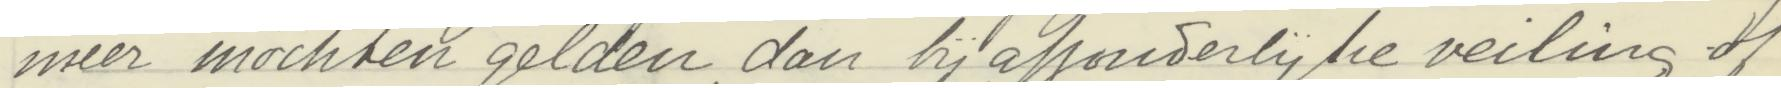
meer mochten gelden dan bij afzonderlijke veiling of
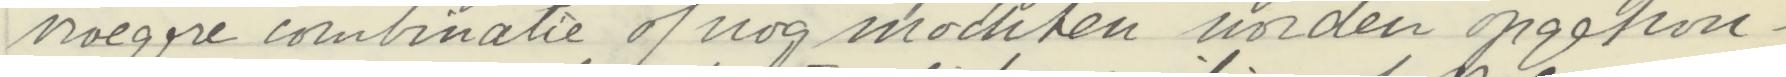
voegere combinatie of nog mochten worden opgehou
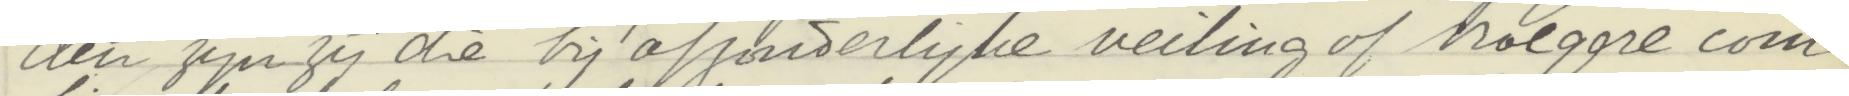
den zijn zij die bij afzonderlijke veiling of vroegere com
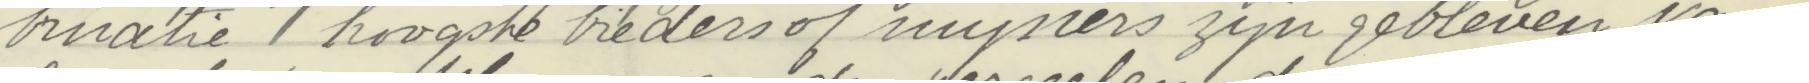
binatie hoogste bieders of mijners zijn gebleven van
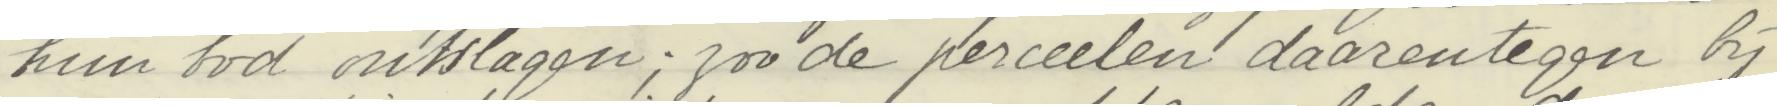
hun bod ontslagen; zoo de perceelen daarentegen bij
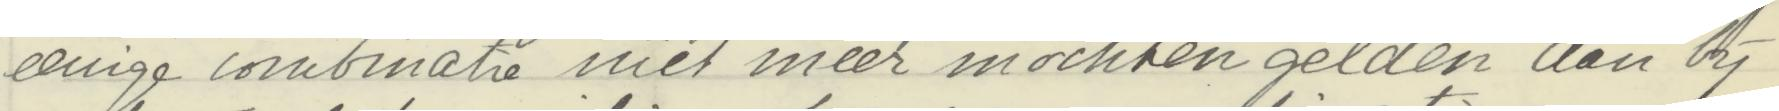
eenige combinatie niet meer mochten gelden dan bij
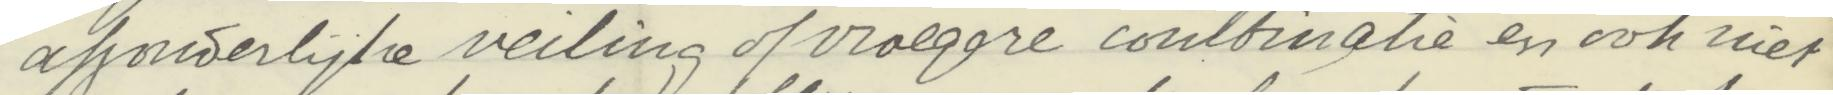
afzonderlijke veiling of vroegere combinatie en ook niet
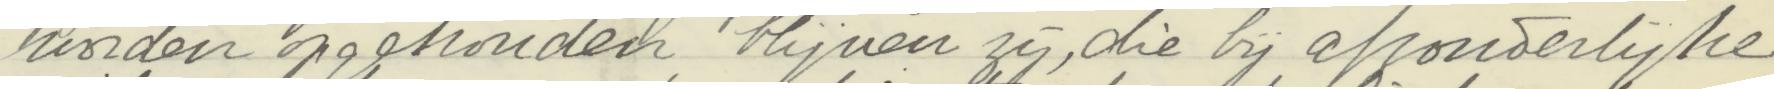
worden opgehouden, blijven zij, die bij afzonderlijke
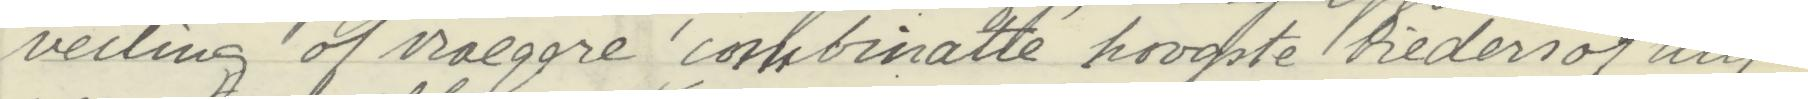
veiling of vroegere combinatie hoogste bieders of mij-
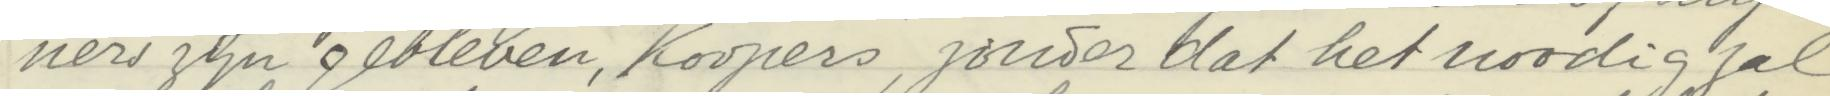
ners zijn gebleven, koopers, zonder dat het noodig zal
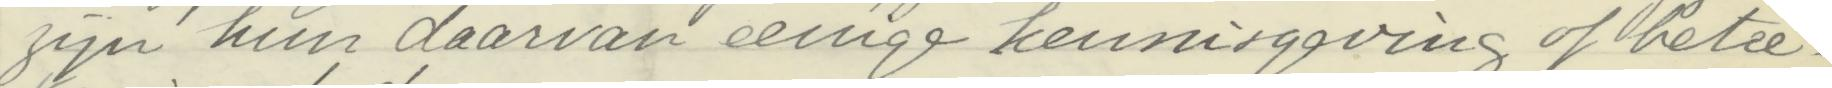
zijn hun daarvan eenige kennisgeving of betee-
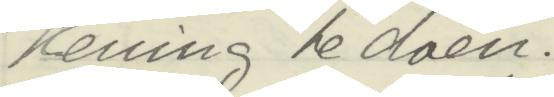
kening te doen
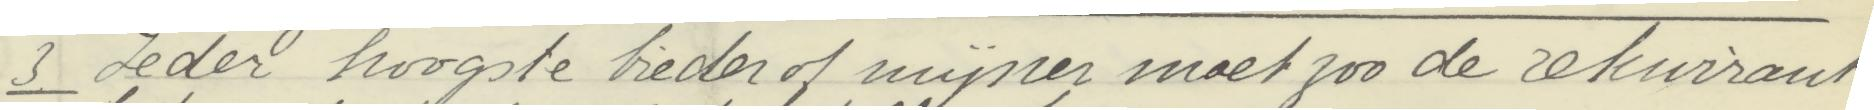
3. Ieder hoogste bieder of mijner moet zoo de rekwirant
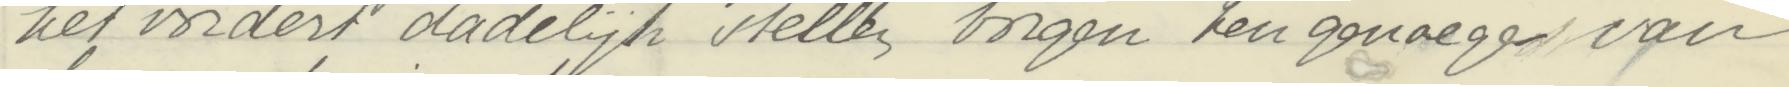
het vordert dadelijk stellen borgen ten genoege, van
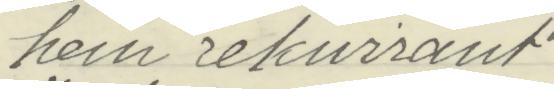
hem rekwirant
